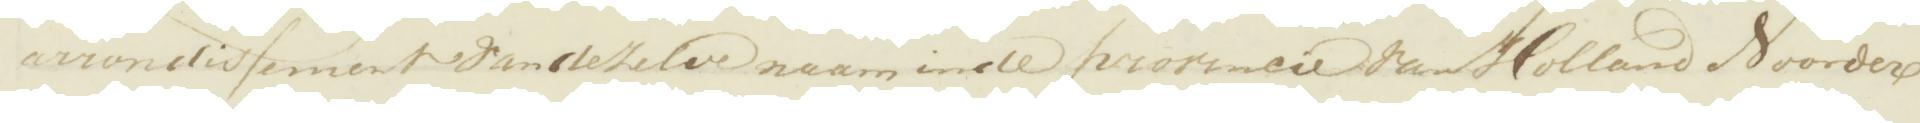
arrondissement van dezelve naam in de provincie van Holland Noorder
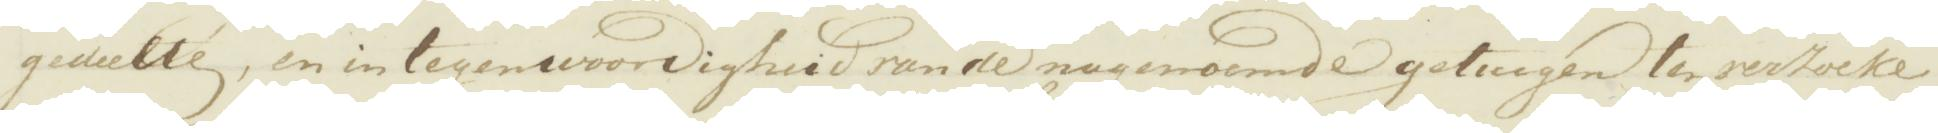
gedeelte, en in tegenwoordigheid van de nagenoemde getuigen ter verzoeke
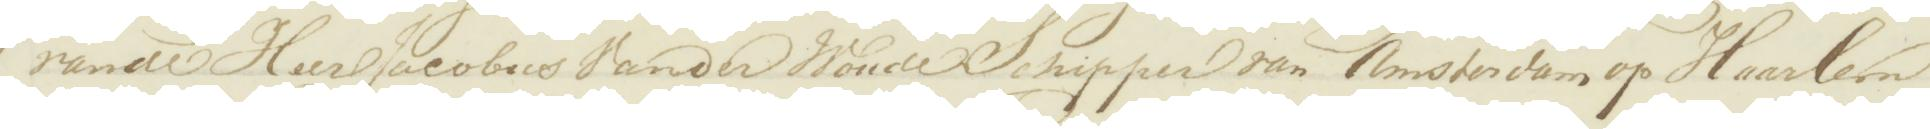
van de Heer Jacobus Vander Woude Schipper van Amsterdam op Haarlem
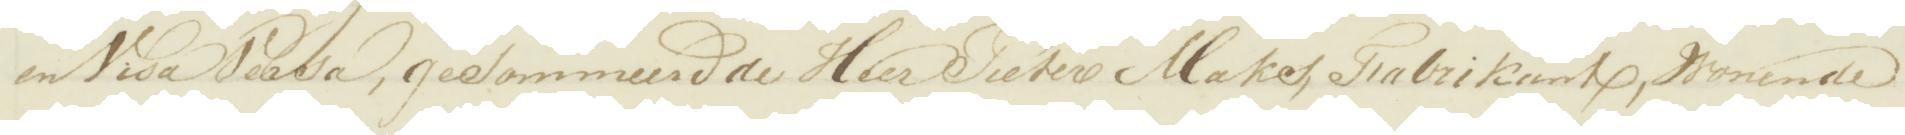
en Visa Versa, gesommeerd de Heer Pieter Maks, Fabrikant, wonende
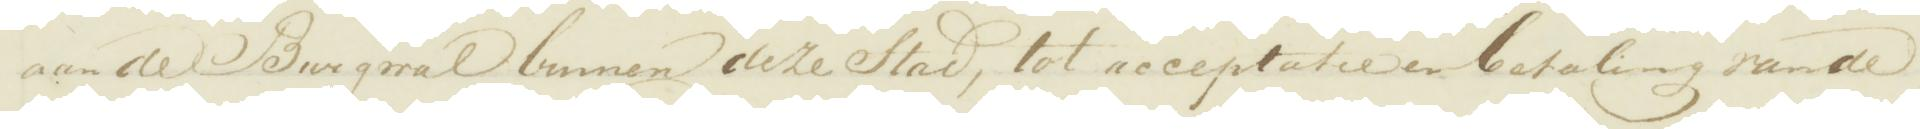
aan de Burgwal binnen deze Stad, tot acceptatie en betaling van de
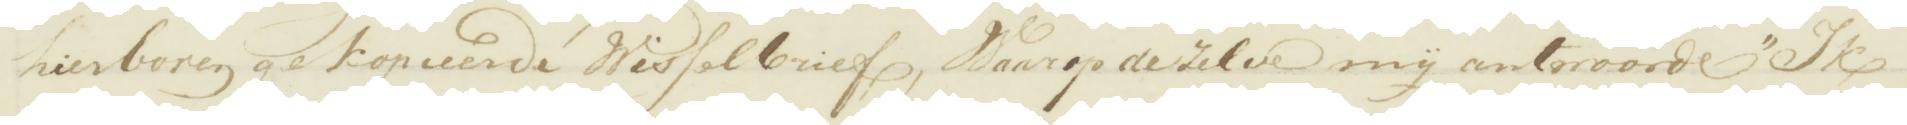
hier boven gekopieerde Wisselbrief, Waarop dezelve mij antwoorde "Ik
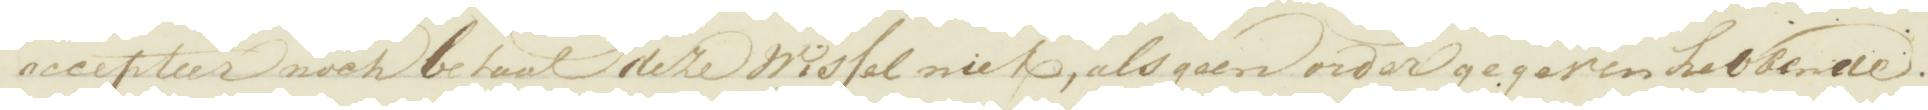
accepteer noch betaal deze Wissel niet, als geen order gegeven hebbende.
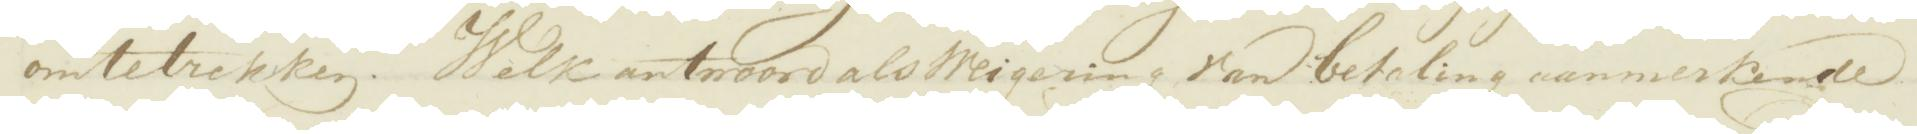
omtetrekken." Welk antwoord als weigering van betaling aanmerkende
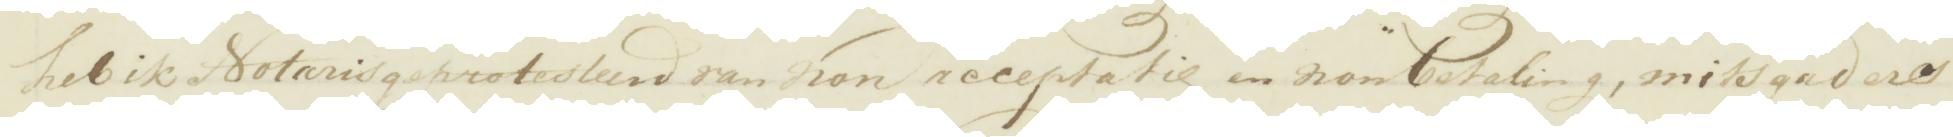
heb ik Notaris geprotesteerd van non acceptatie en non betaling, mitsgaders
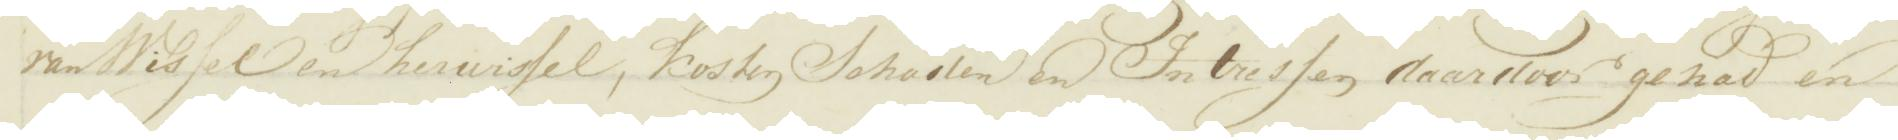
van Wissel en herwissel, kosten schaden en Intressen daar door gehad en
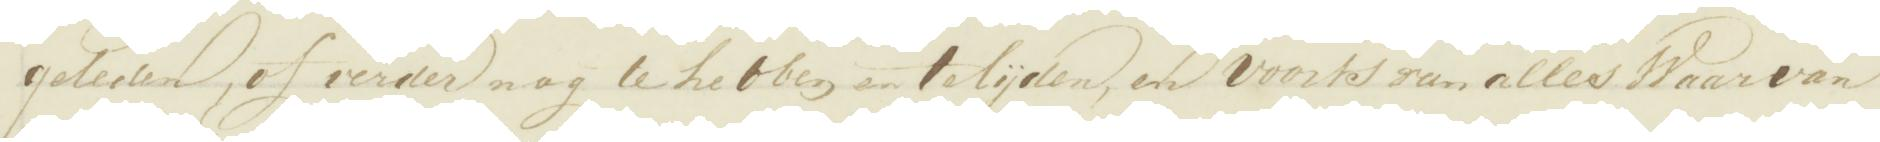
geleden of verder nog te hebben en telijden, en voorts van alles Waarvan
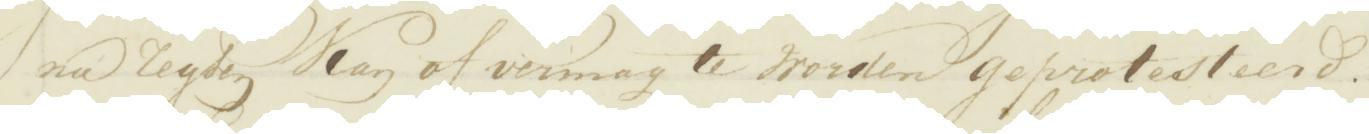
nu regten Kan of vermag te worden geprotesteerd.
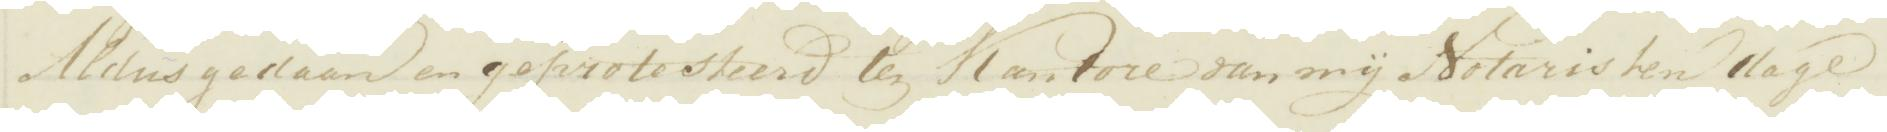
Aldus gedaan en geprotesteerd ten Kantore van mij Notaris ten dage
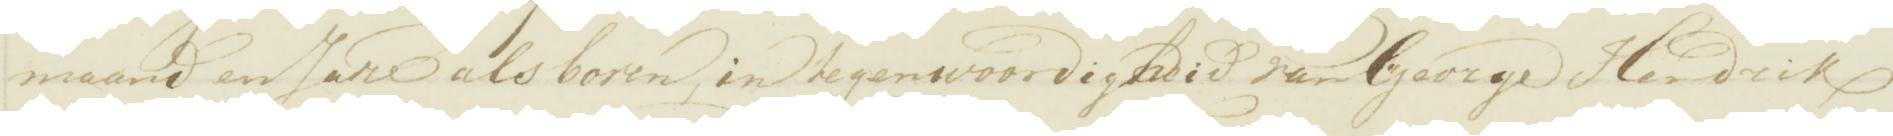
maand en Jare als boven, in tegenwoordigheid van George Hendrik
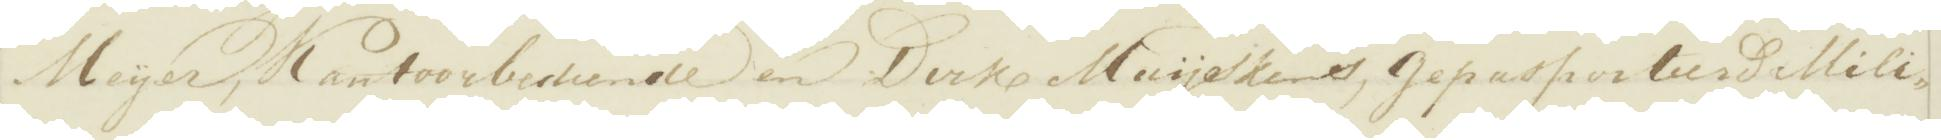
Meijer, Kantoorbediende en Dirk Muijskens, gepasporteerd Mili„
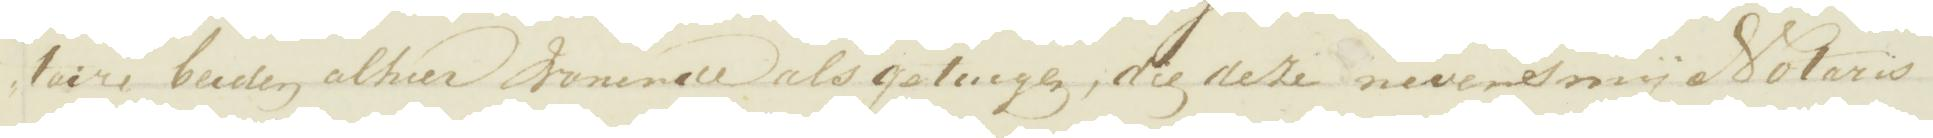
„tair beiden alhier wonende als getuigen, die deze nevens mij Notaris
